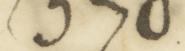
370
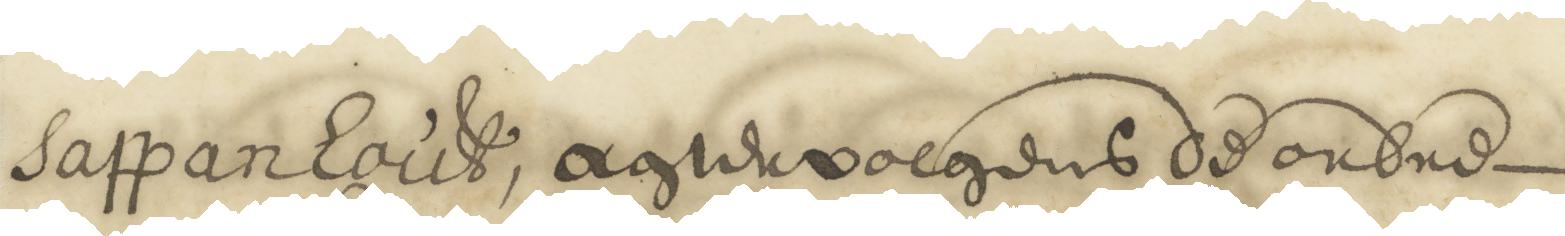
sappanhout, agtervolgens de ordre —
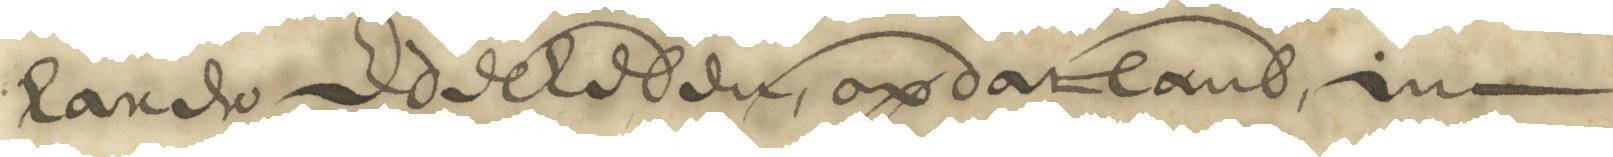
harer Edelheden, op dat land, in
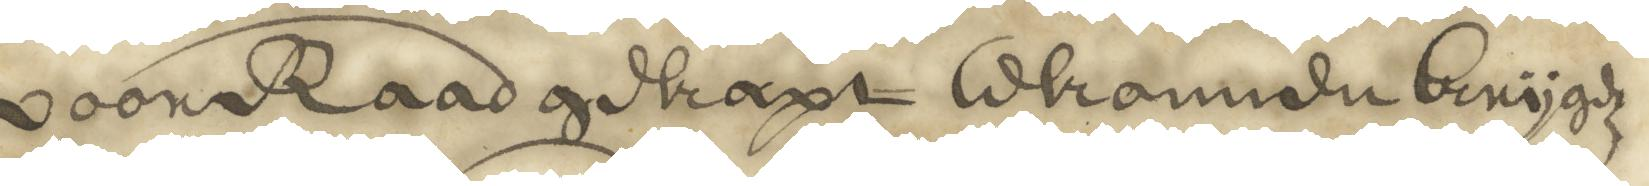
voorRaad gekapt tekonnen krijgen
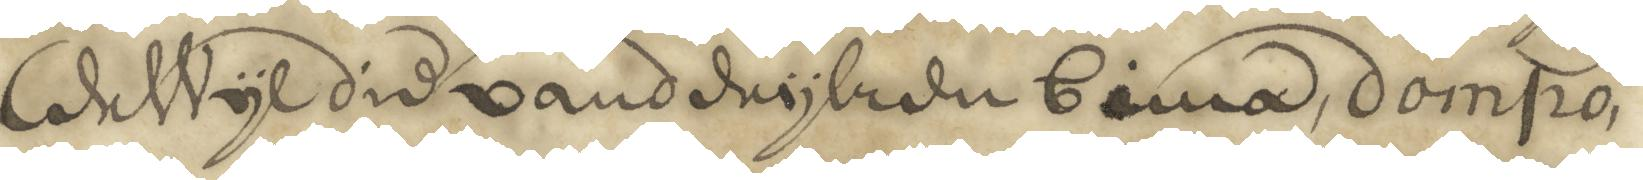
terWijl die vanderijken bima, dompo,
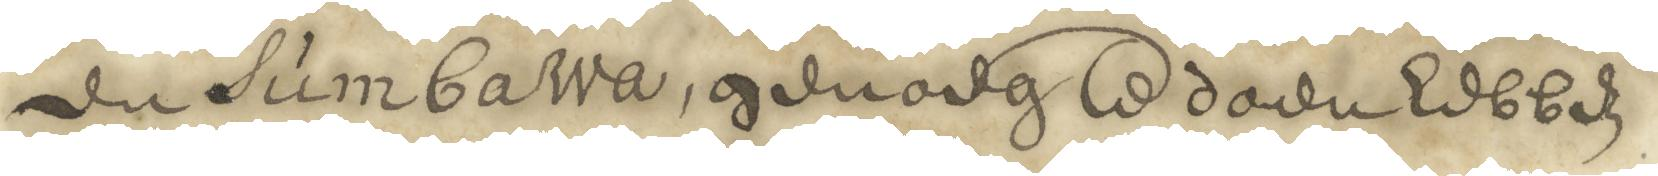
en sumbawa, genoeg te doen hebben
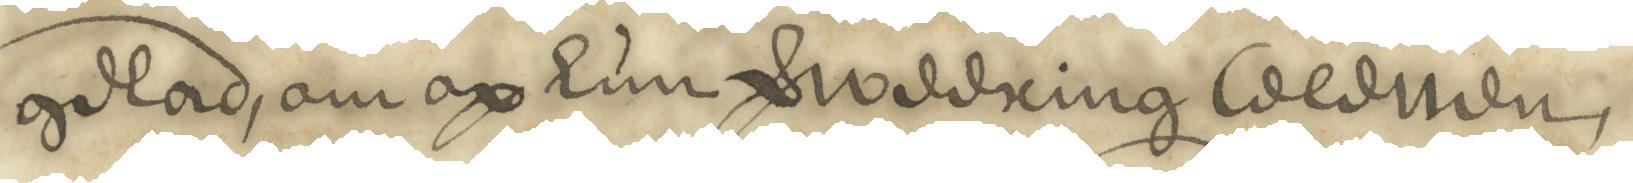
gehad, om op hun verweering teletten,
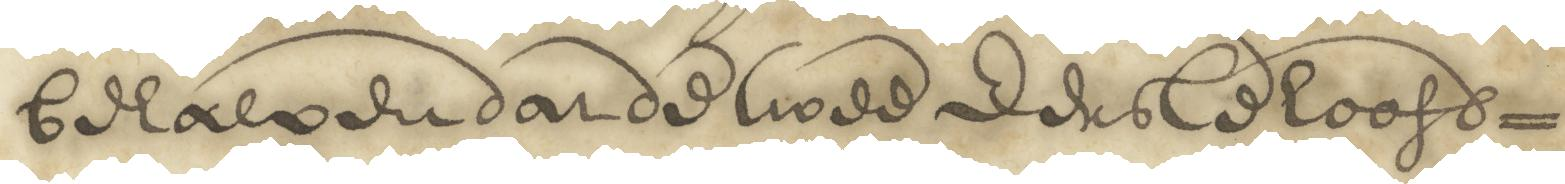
behalven dat de twee eerste hoofd=
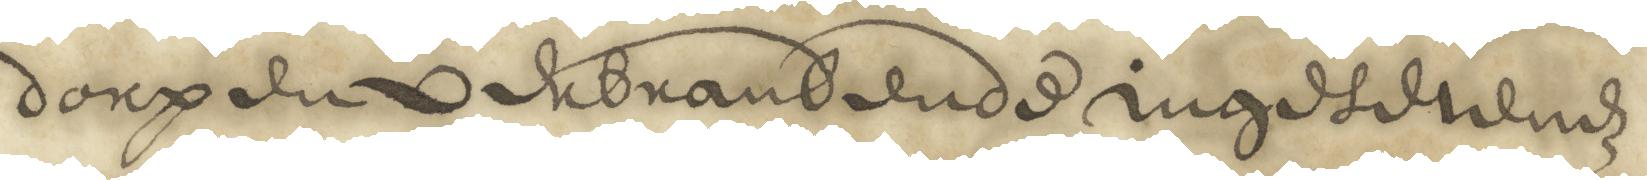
dorpen verbrandende ingesetenen
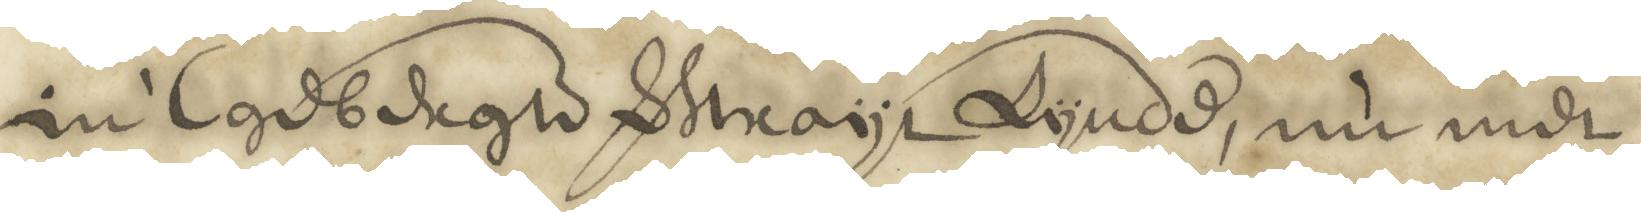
in ’t gebergte verstraijt zijnde, nu met
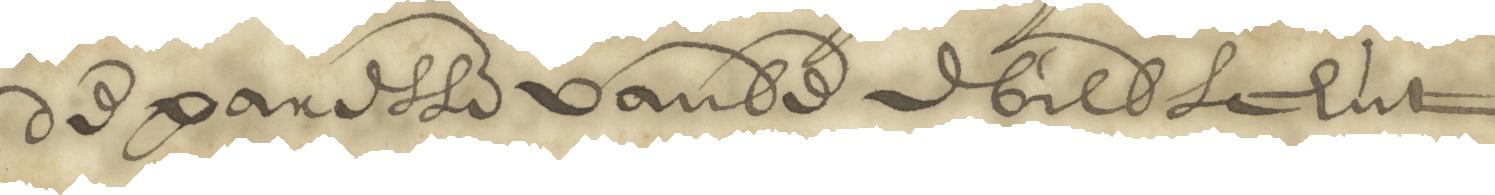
de paresse vande wildschut
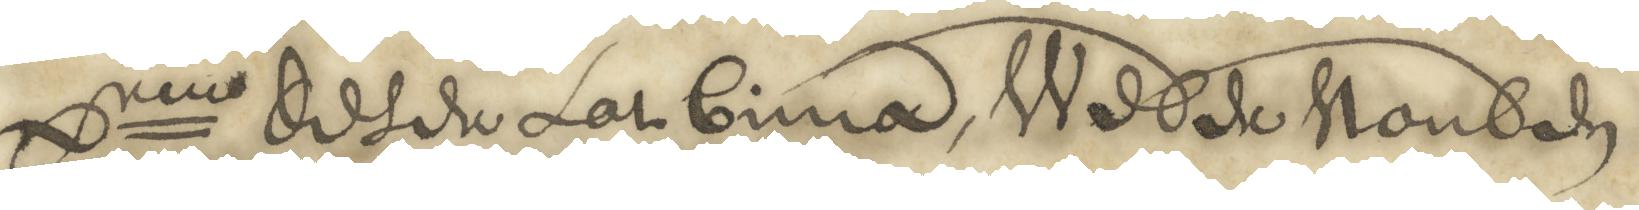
p=rmo deser tot bima, Weder stonden
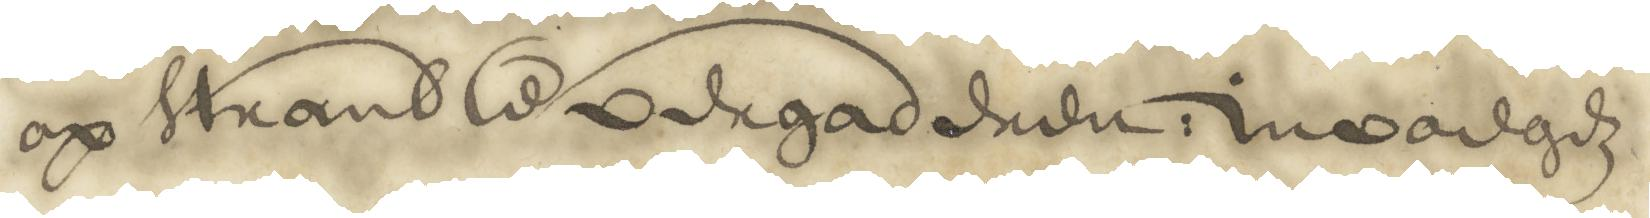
op strand te vergaderen: invoegen
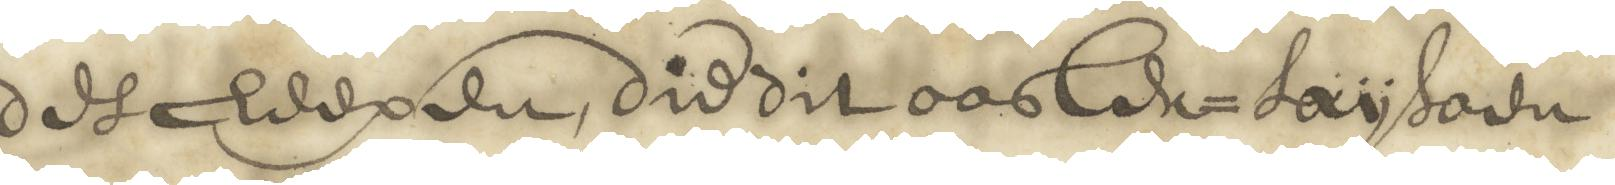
descheepen, die dit ooster=saijsoen
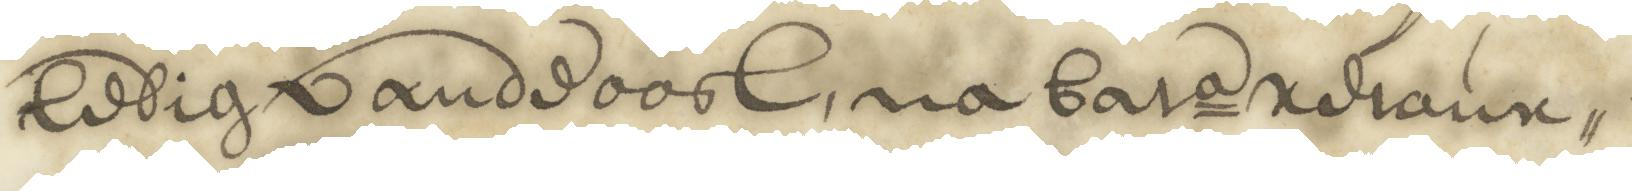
ledig van de oost, na bat=a retour„
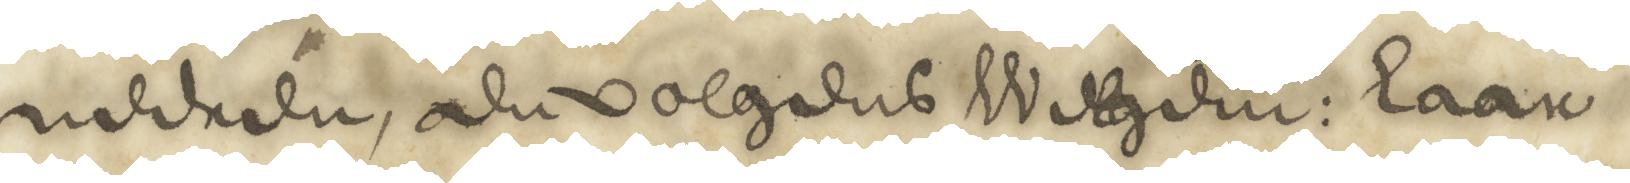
neeren, en volgens Welgem: haar
